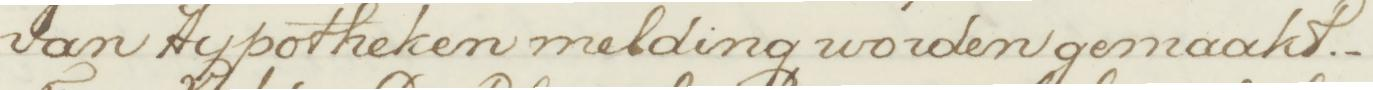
van Hypotheken melding worden gemaakt.-
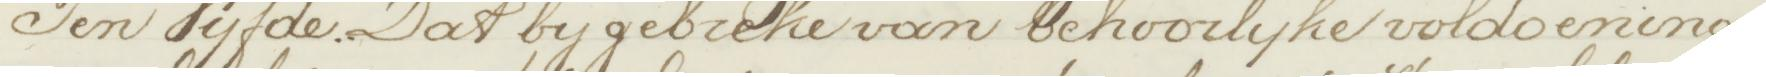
Ten Vyfde. Dat by gebreke van behoorlyke voldoening
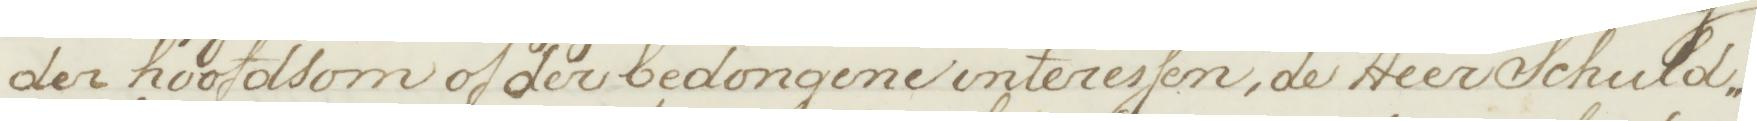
der hoofdsom of der bedongene interessen, de Heer Schuld„
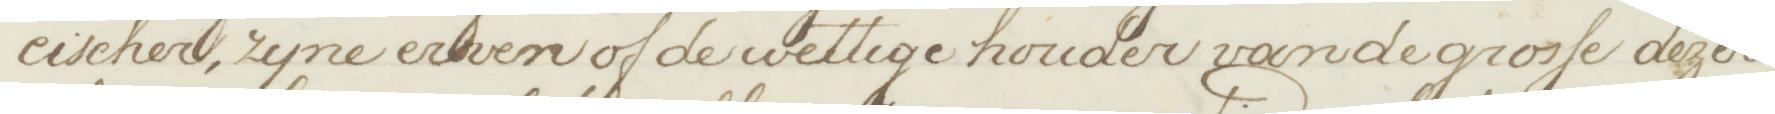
eischer, zyne erven of de wettige houder van de grosse dezer
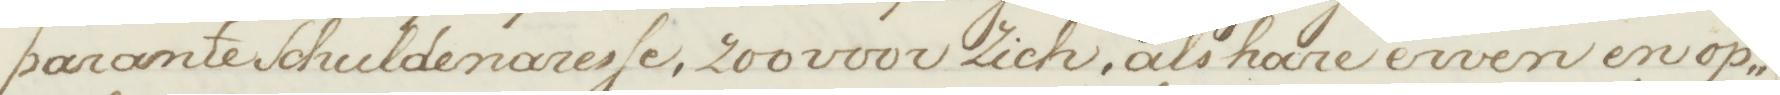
parante schuldenaresse, zoo voor zich, als hare erven en op„
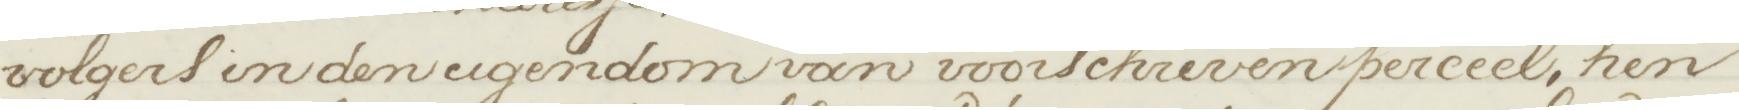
volgers in den eigendom van voorschreven perceel, hen
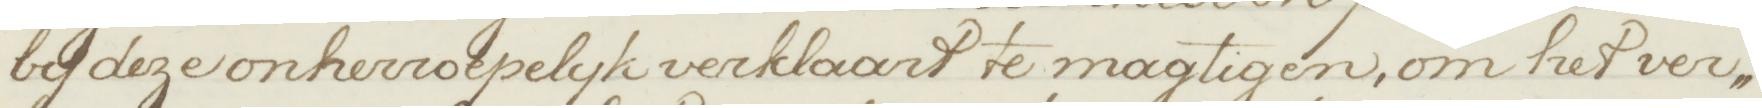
by deze onherroepelyk verklaart te magtigen, om het ver„
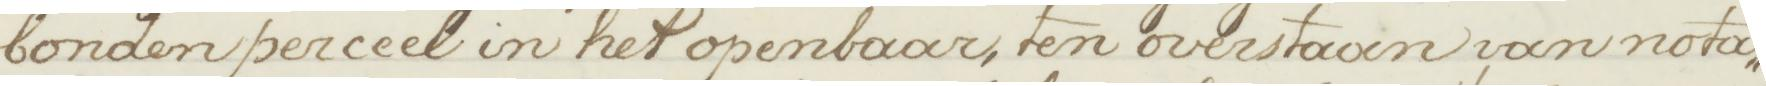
bonden perceel in het openbaar, ten overstaan van nota„
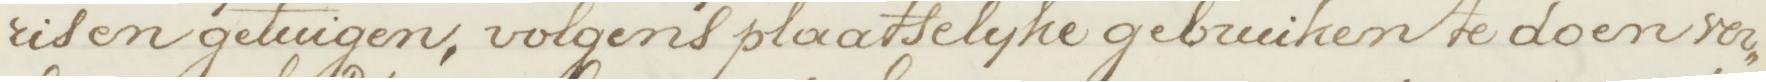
ris en getuigen, volgens plaatselyke gebruiken te doen ver„
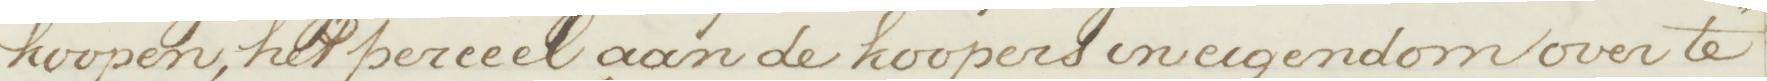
koopen, het perceel aan de koopers in eigendom over te
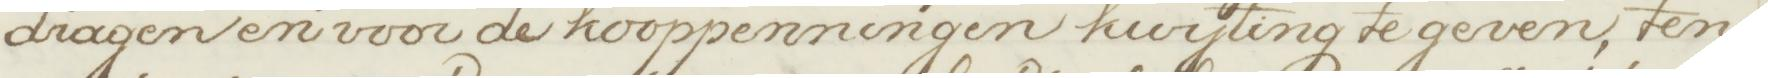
dragen en voor de kooppenningen kwyting te geven, ten
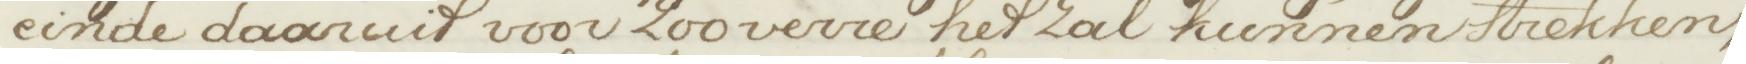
einde daaruit voor zoo verre het zal kunnen strekken,
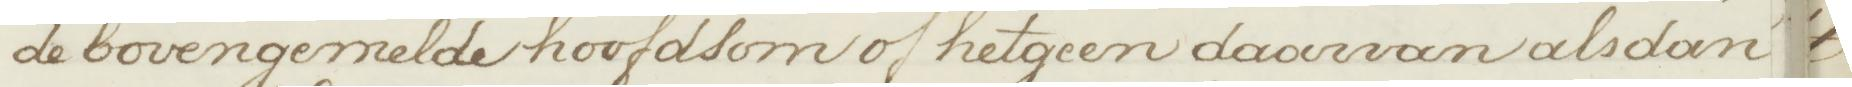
de bovengemelde hoofdsom of hetgeen daarvan als dan
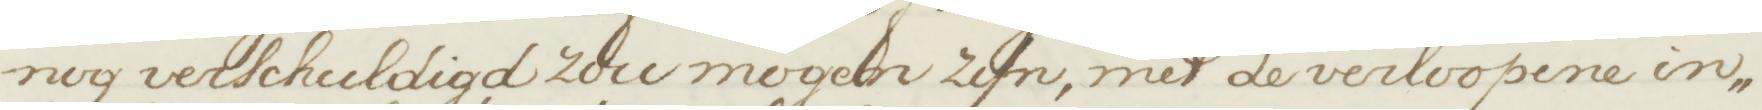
nog verschuldigd zou mogen zyn, met de verloopene in„
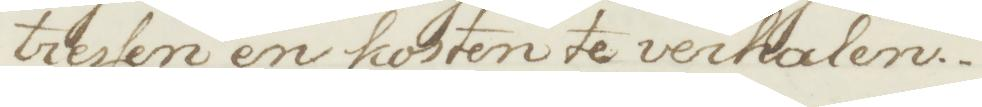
tressen en kosten te verhalen.
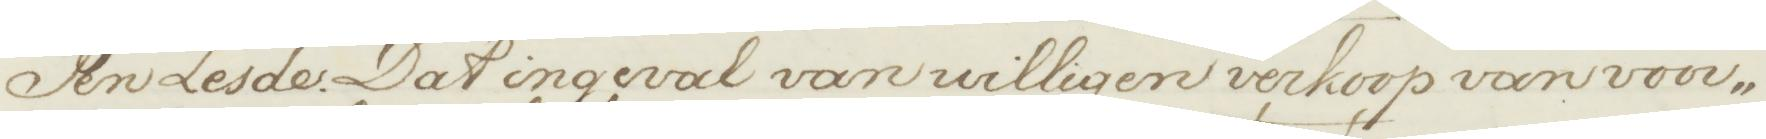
Ten Zesde. Dat ingeval van willigen verkoop van voor„
